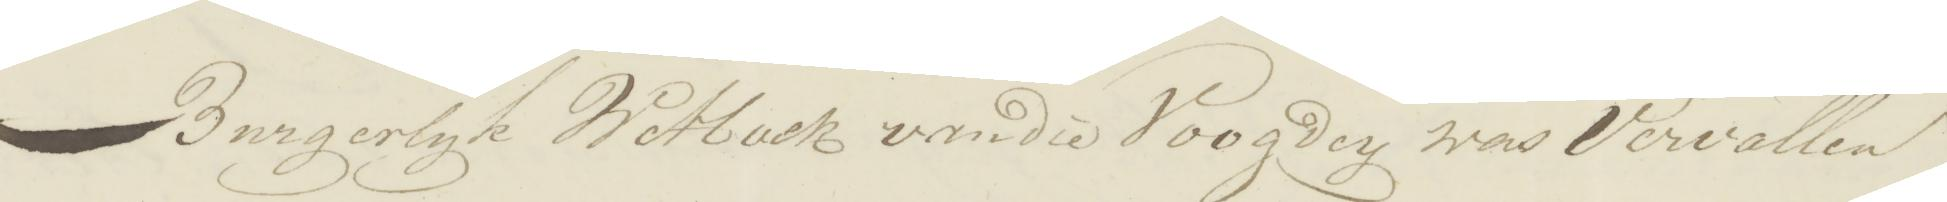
Burgerlyk Wetboek van die Voogdey was Vervallen
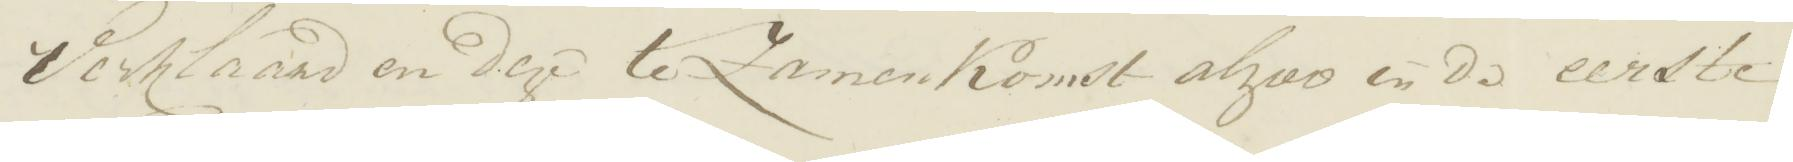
Verklaard en deze te Zamenkomst alzoo in de eerste
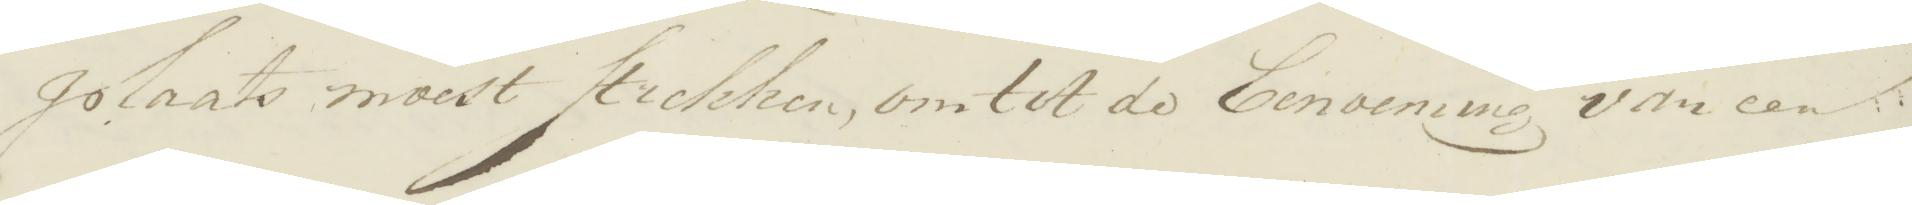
plaats moest strekken, om tot de benoeming van een
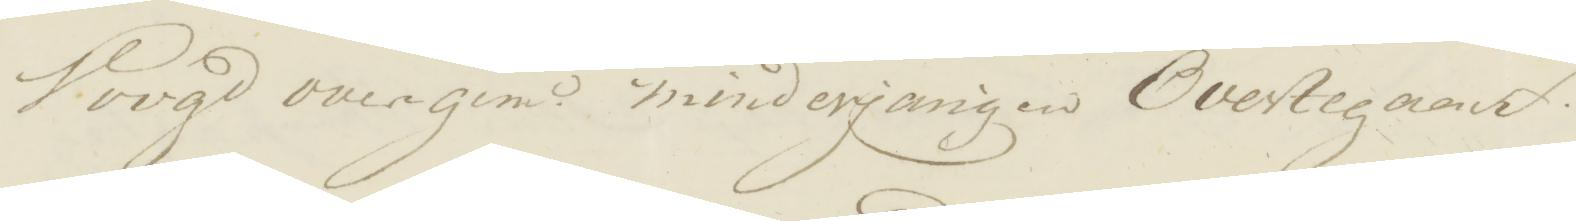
Voogd over gem.e minderjarigen Overtegaan.
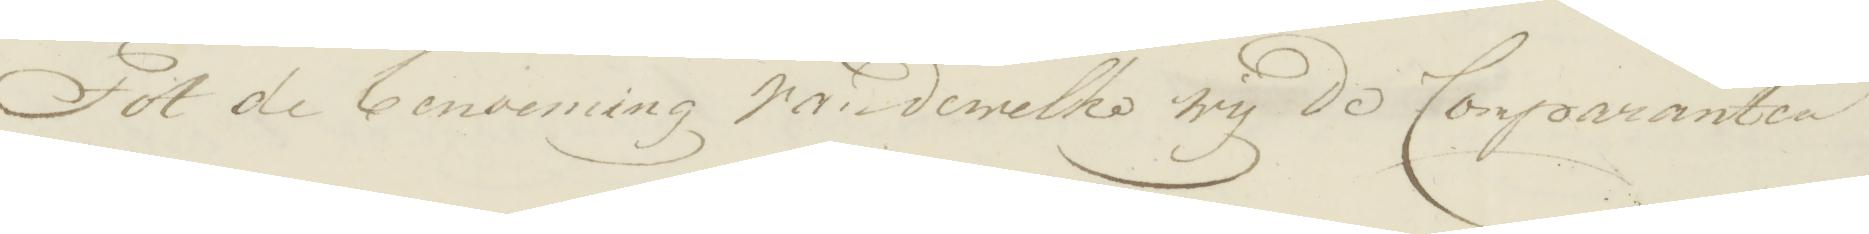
Tot de benoeming van dewelke wy de Comparanten
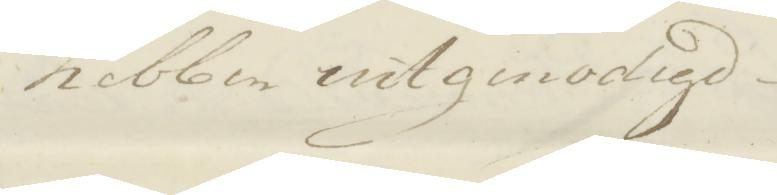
hebben uitgenodigd
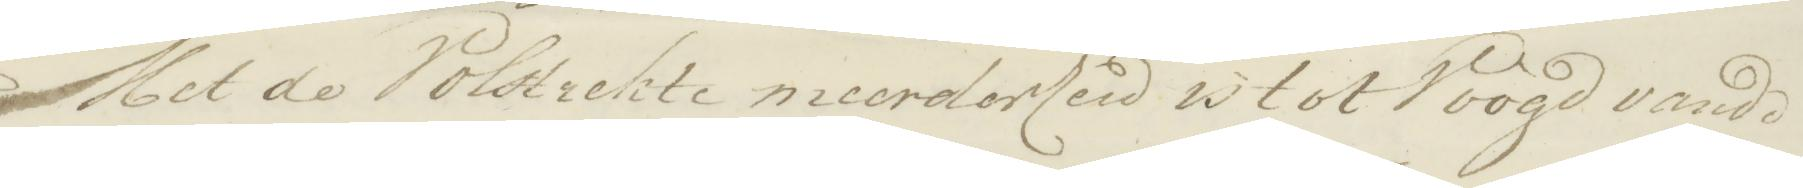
Met de Volstrekte meerderheid is tot Voogd van de
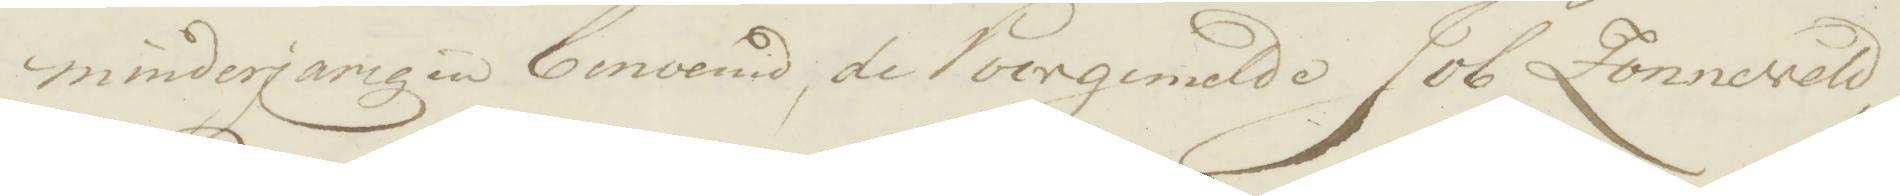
minderjarigen benoemd, de Voorgemelde Job Zonneveld,
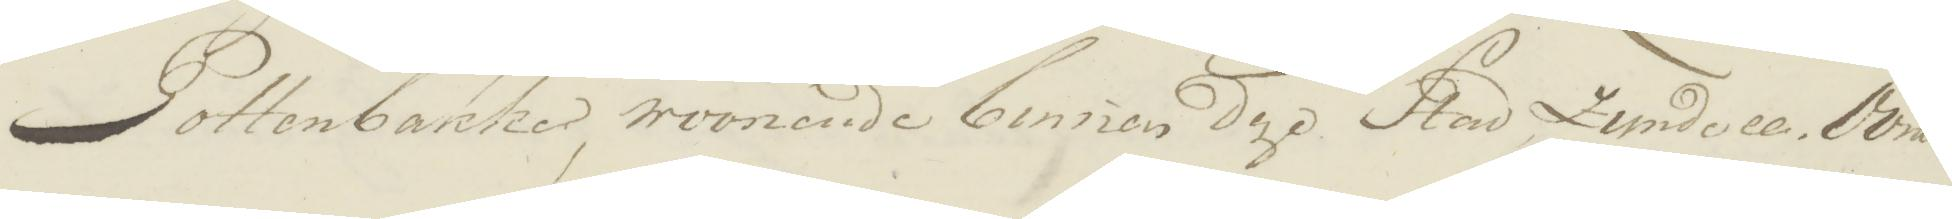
Pottenbakker, woonende binnen deze Stad, zynde een Oom
